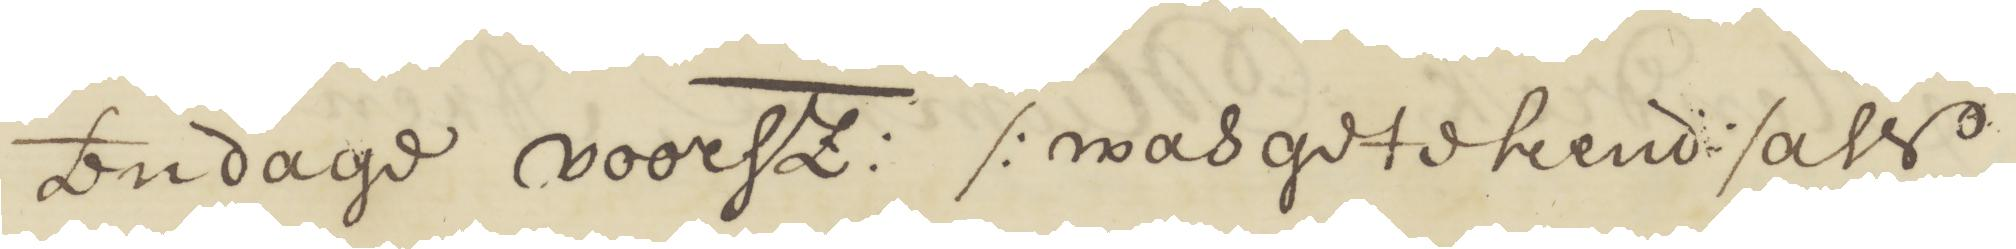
ten dage voorsz: /:was getekend:/ als
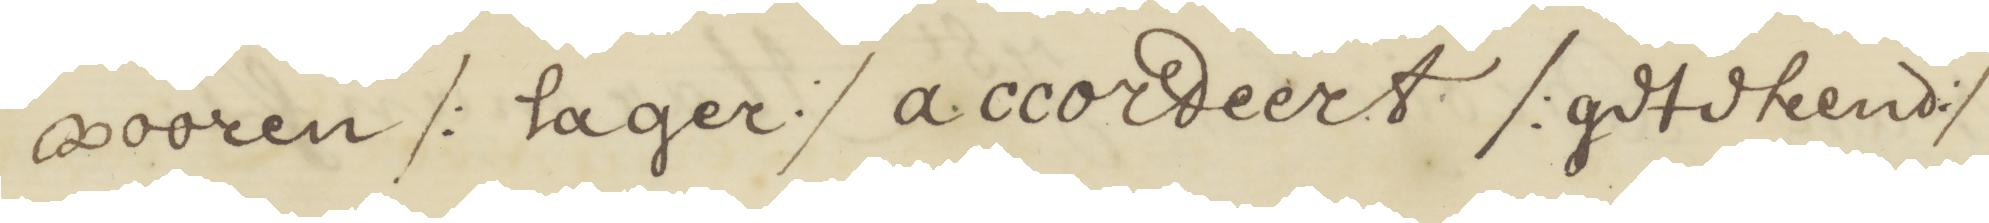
vooren /:lager:/ accordeert /:getekend:/
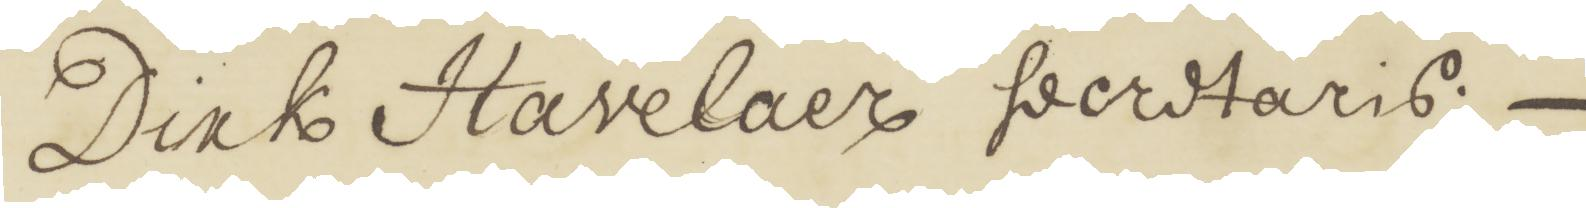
Dirk Havelaer Secretaris;
